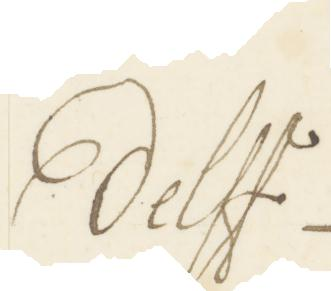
delff
